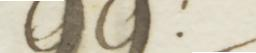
99:
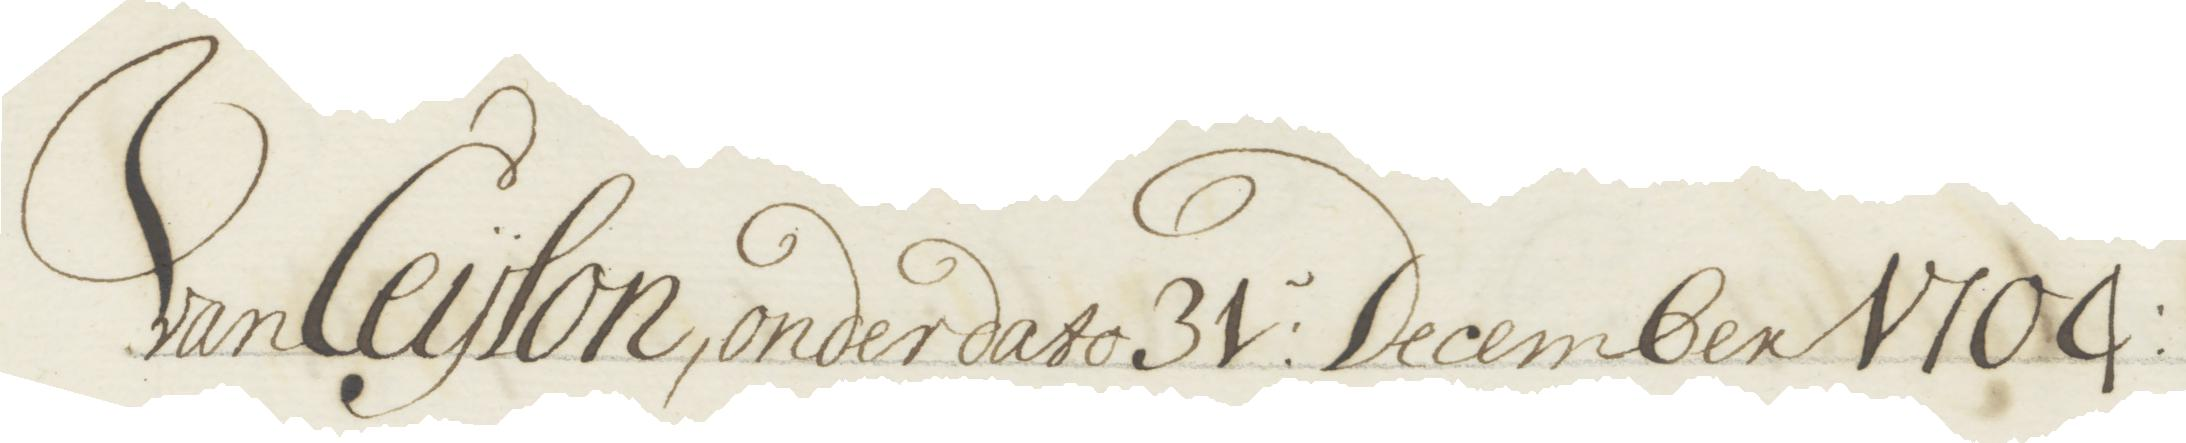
Van Ceijlon, onder dato 31:' December 1704:
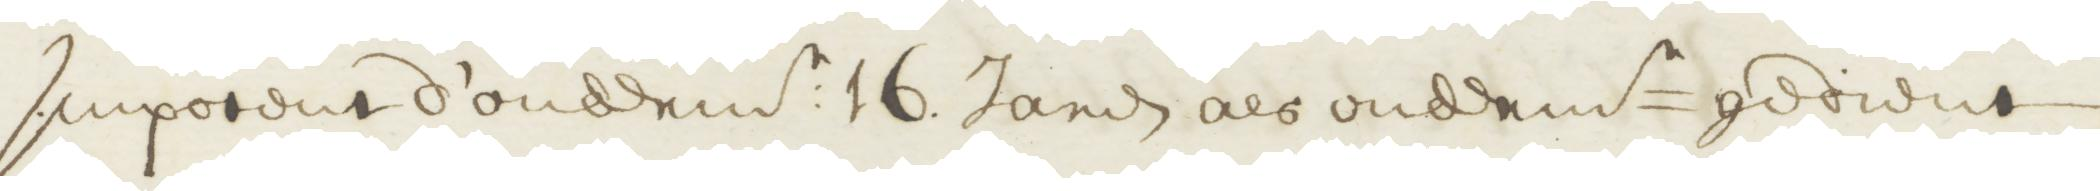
Jmpotent d’ onderm:r 16. Jaren als onderm=r gedient
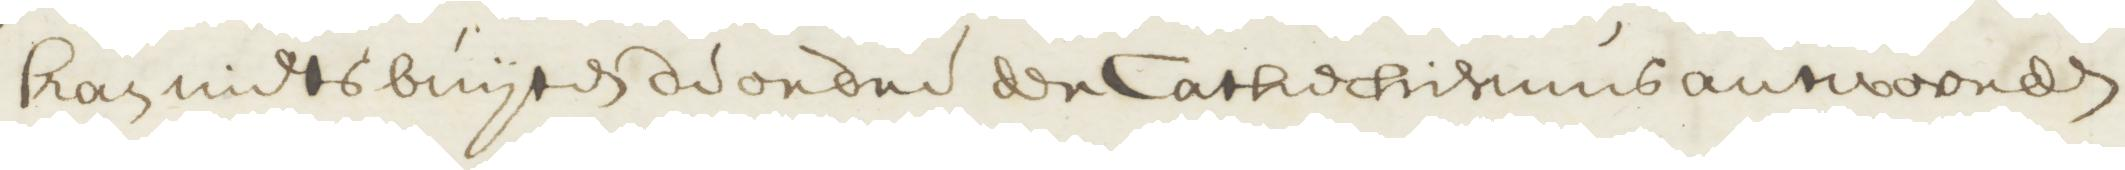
kan niets buijten de ordre der Cathechismus antwoorden
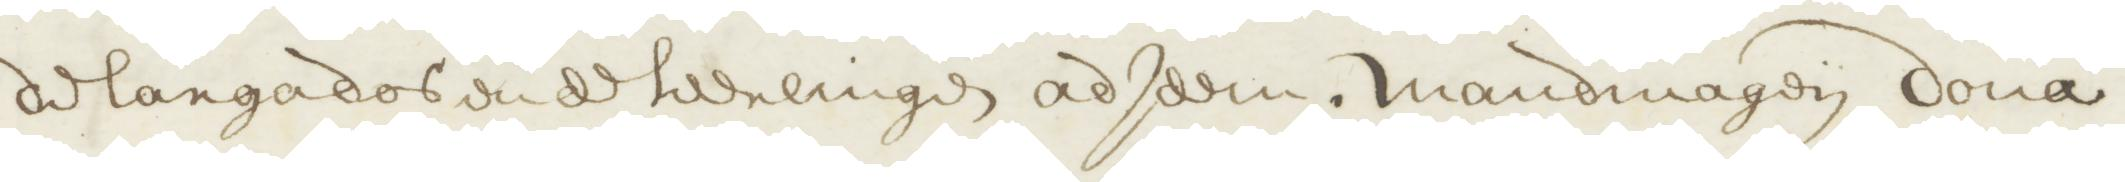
de largados en de leerlingen ad Jdem. mandinageij dona
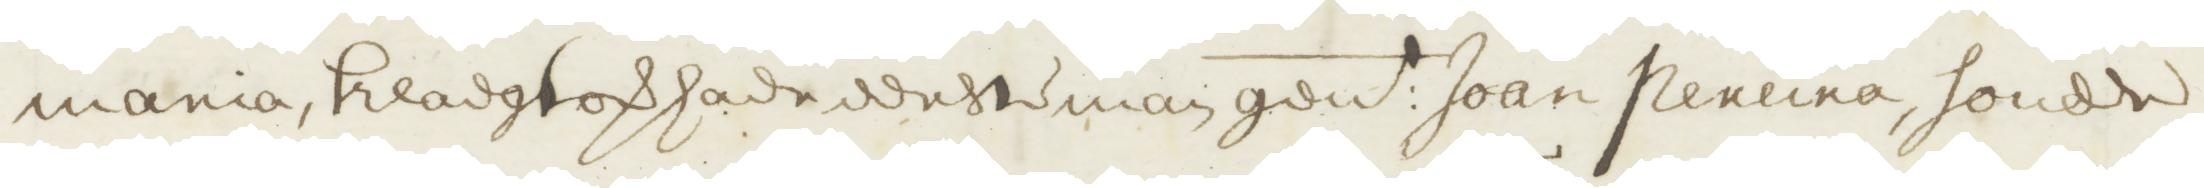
maria, klaegt overhaer eerste man gen:t Joan Pereira, sonder
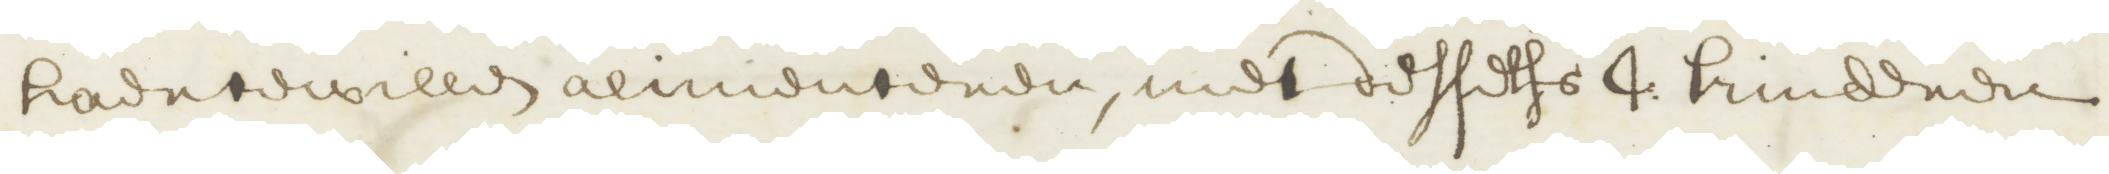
haer te willen alimienteren, met desselfs 4. kinderen
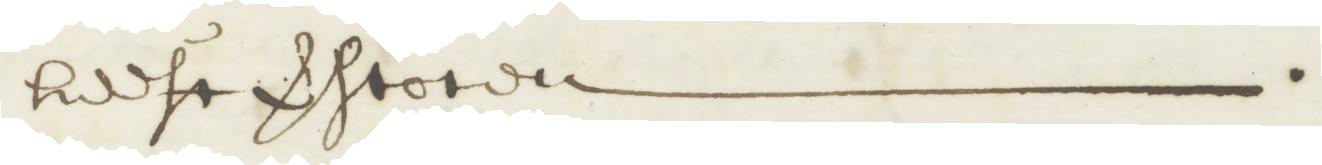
heeft verstoten.
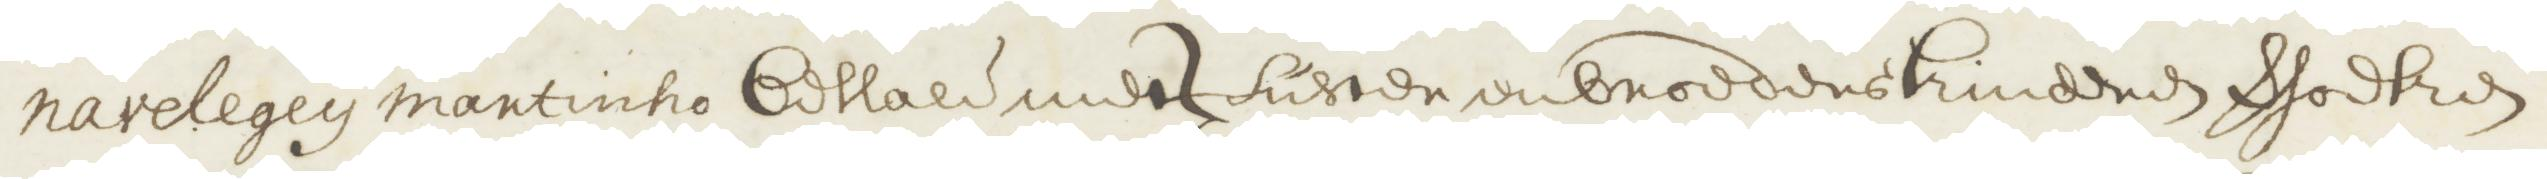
navelegeij martinko beslale met} suster en broeders kinderen versoeken
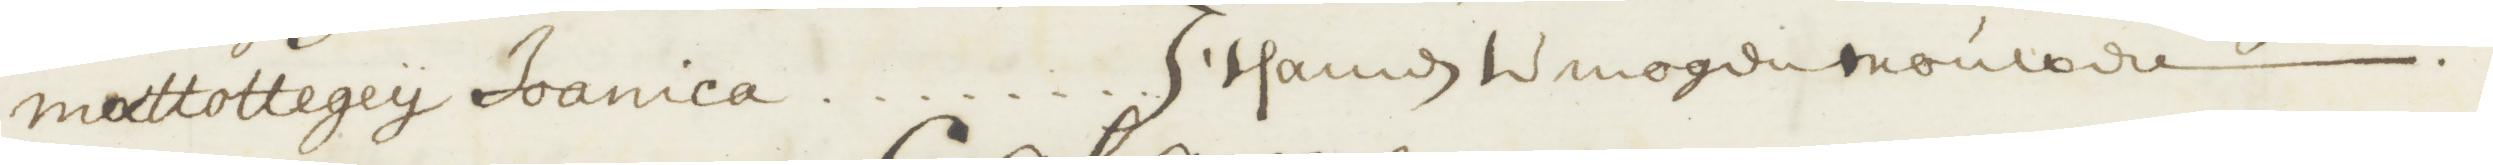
mattottegeij Ioanica. . . . . . .} 'tsamen te mogen trouwen.
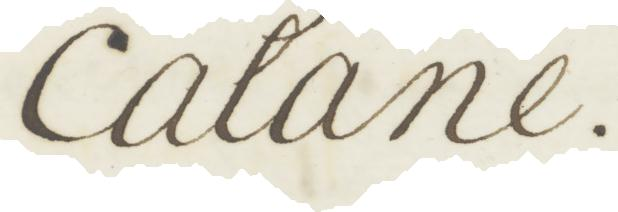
Calane.
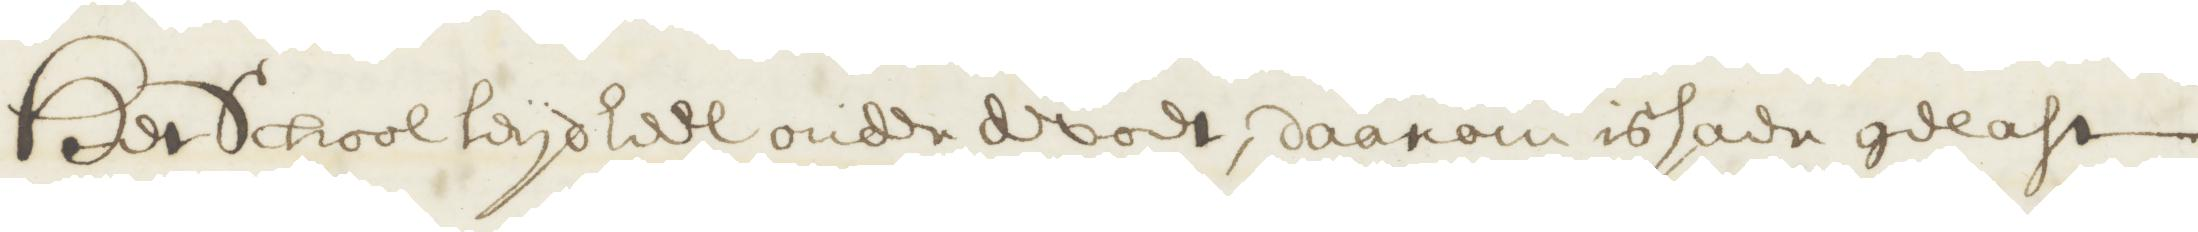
Het School leijd heel onder de voet, daarom is haer gelast
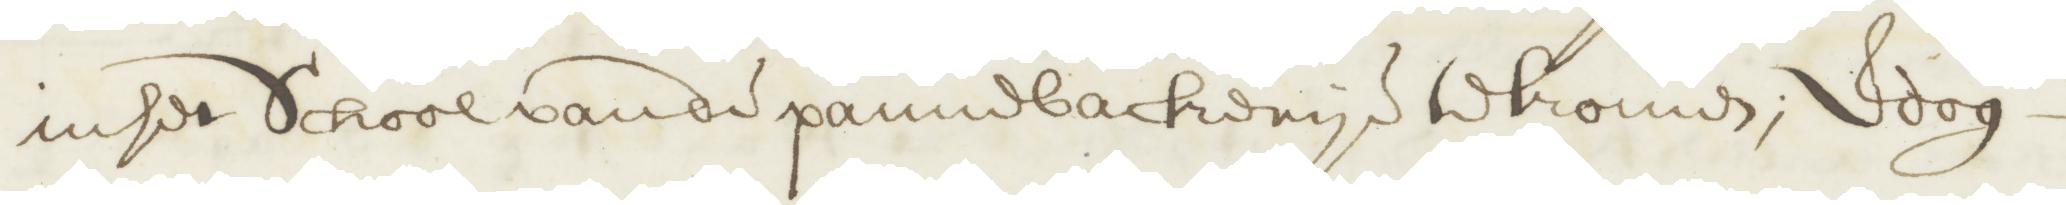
in het school vande pannebackerije tekomen; Edog
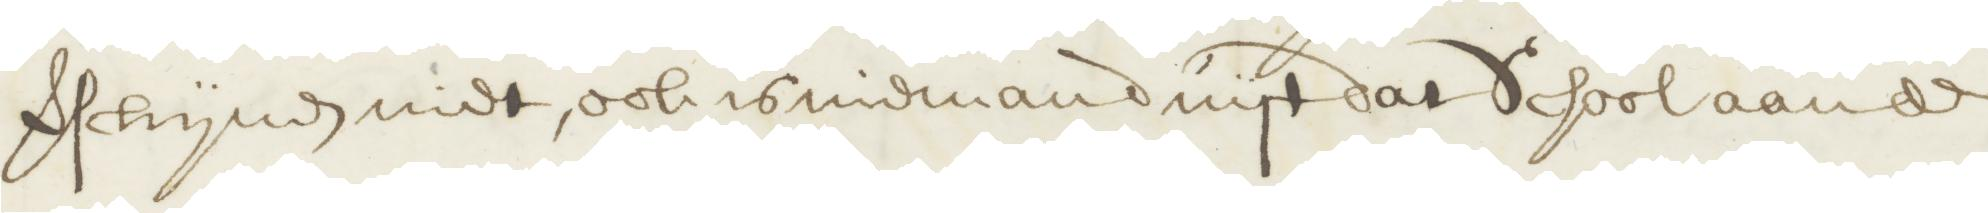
verschijnen niet, ook is niemand uijt dat School aan de
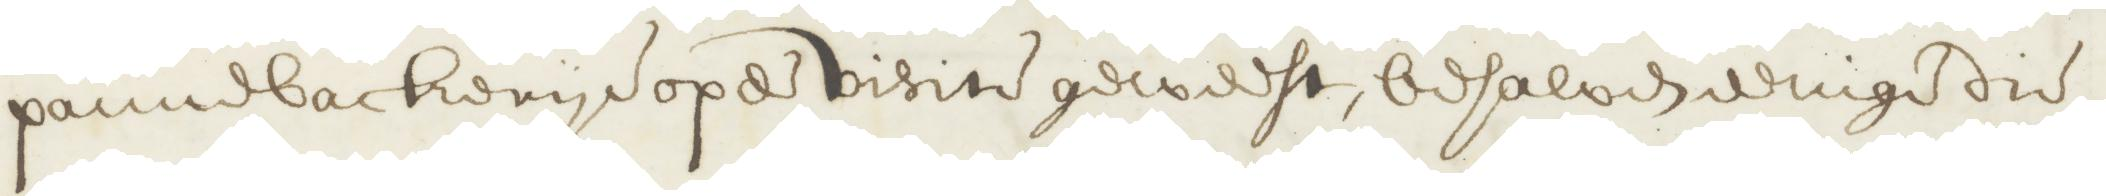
pannebackerije op de visite geweest, behalven eenige die
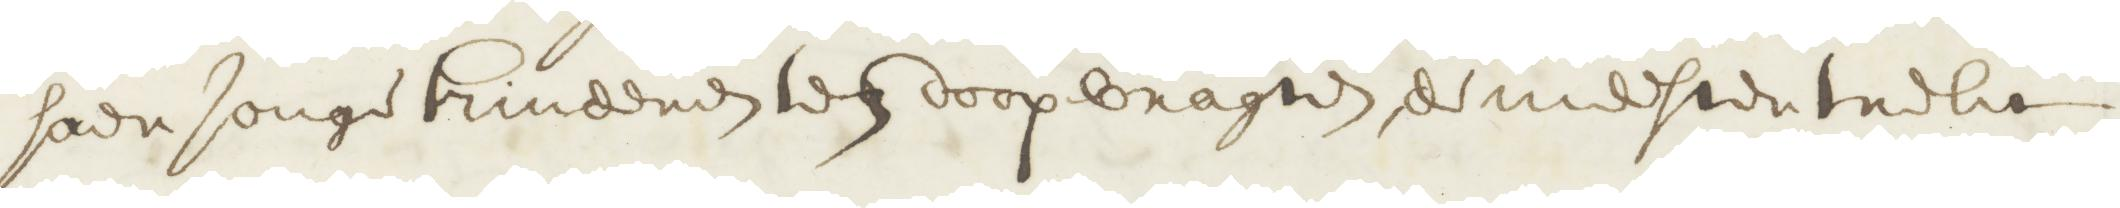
haer jonge kinderen ten doop bragten, de meester trekt
